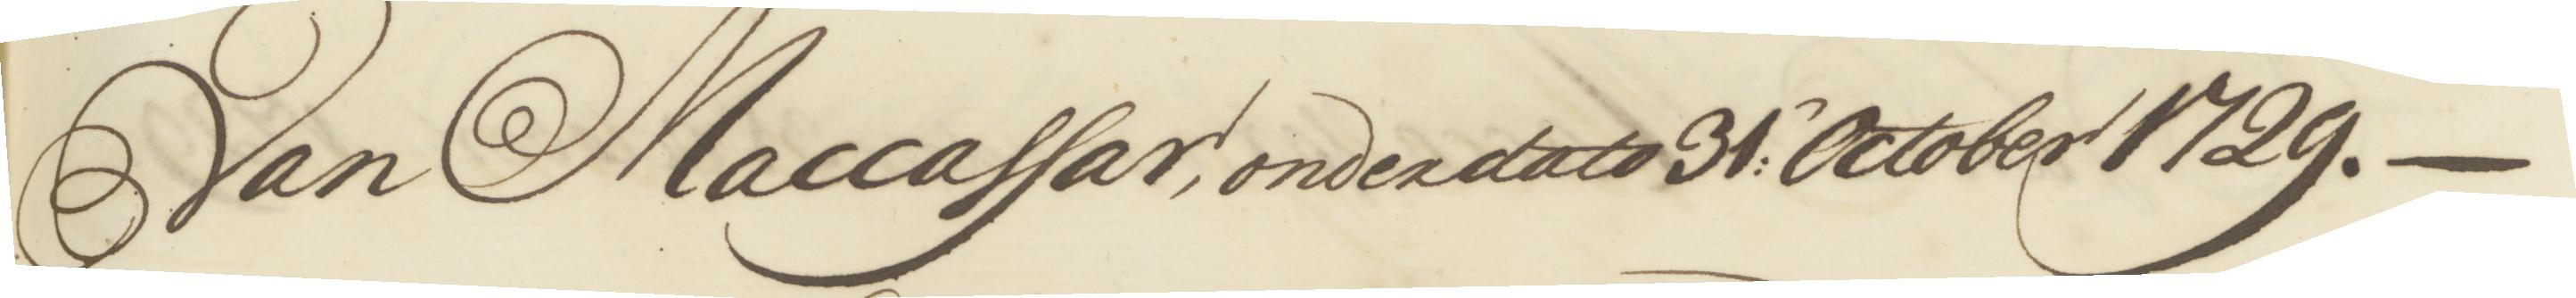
Van Maccassar, onder dato 31:' October 1729. —
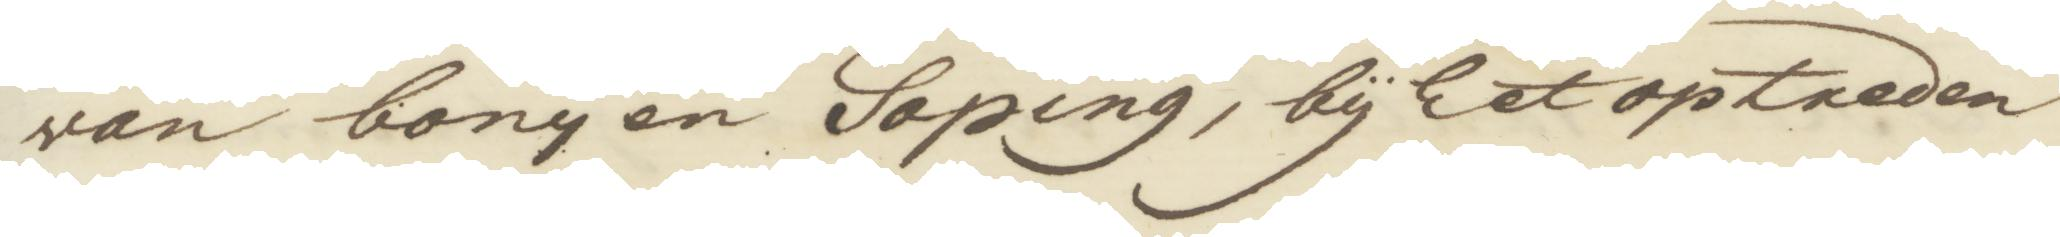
van bonij en soping, bij het optreden
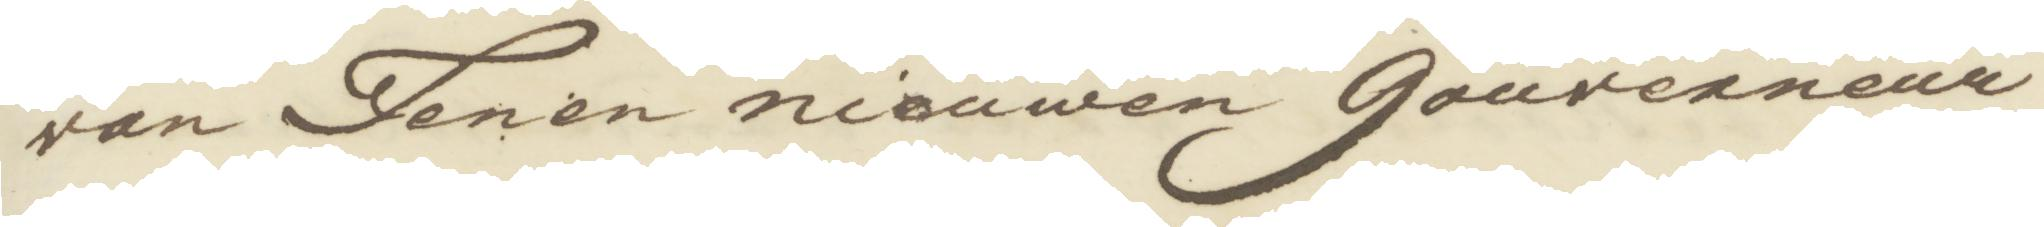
van Eenen nieuwen gouverneur
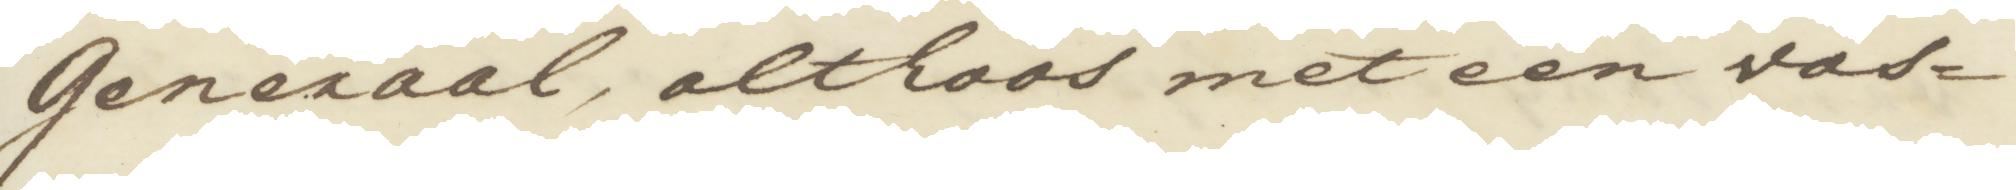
generaal, althoos met een vas=
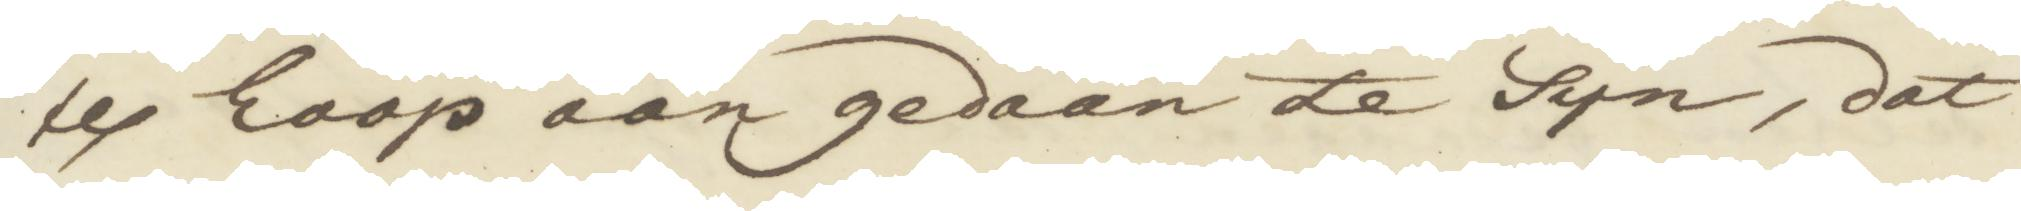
te hoop aan gedaan te sijn, dat
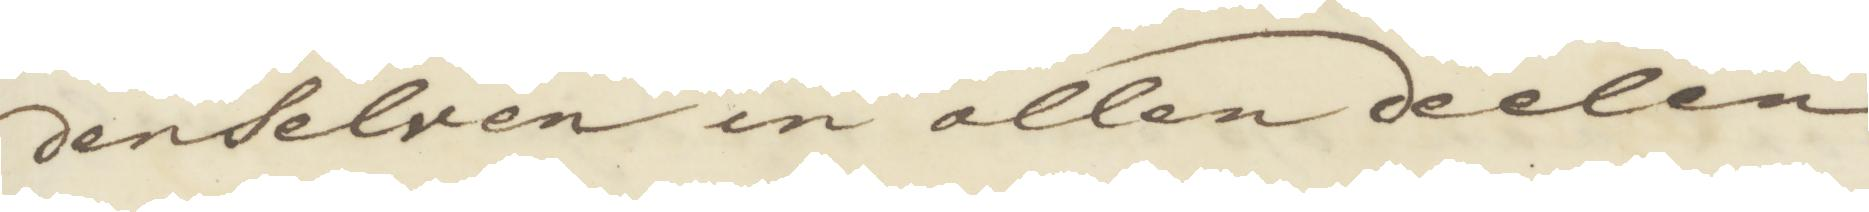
denselven in allen deelen
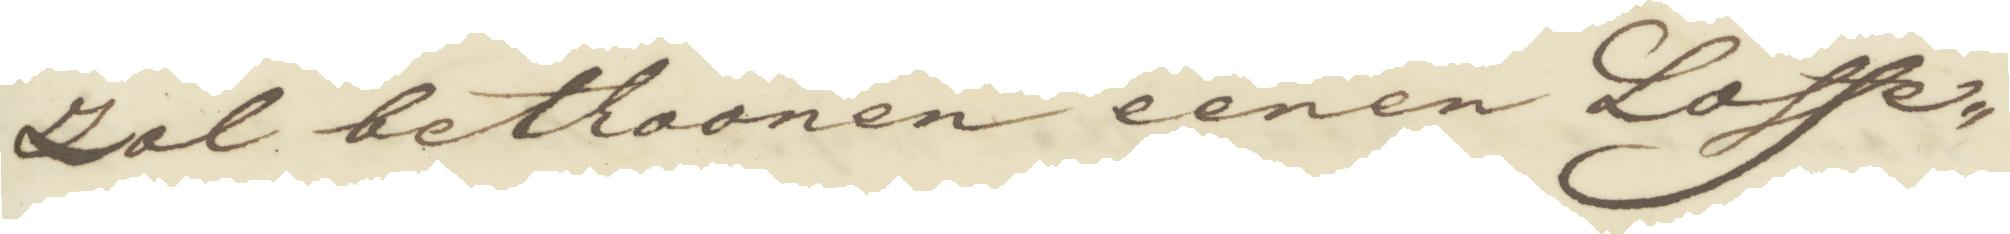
zal bethoonen eenen Loffe„
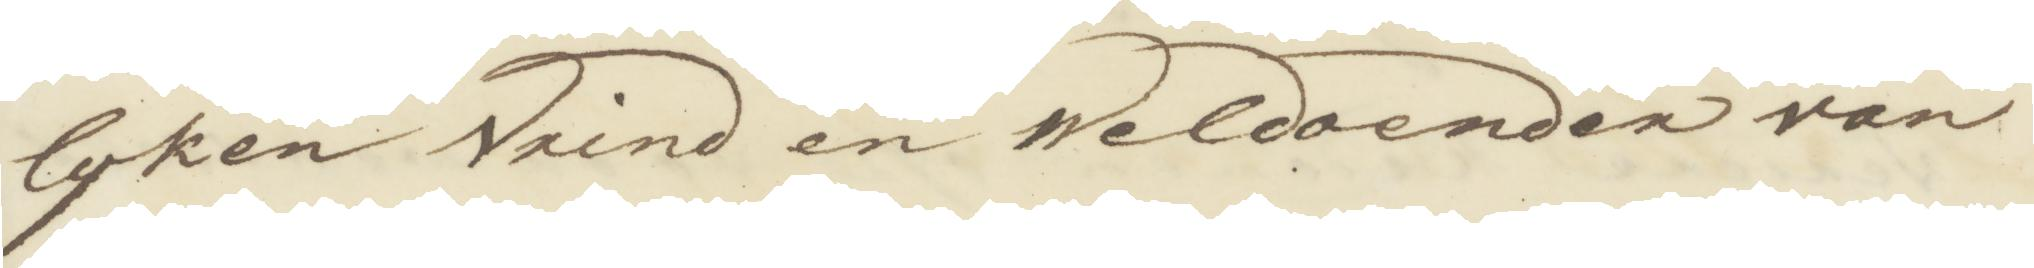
lyken vrind en weldoender van
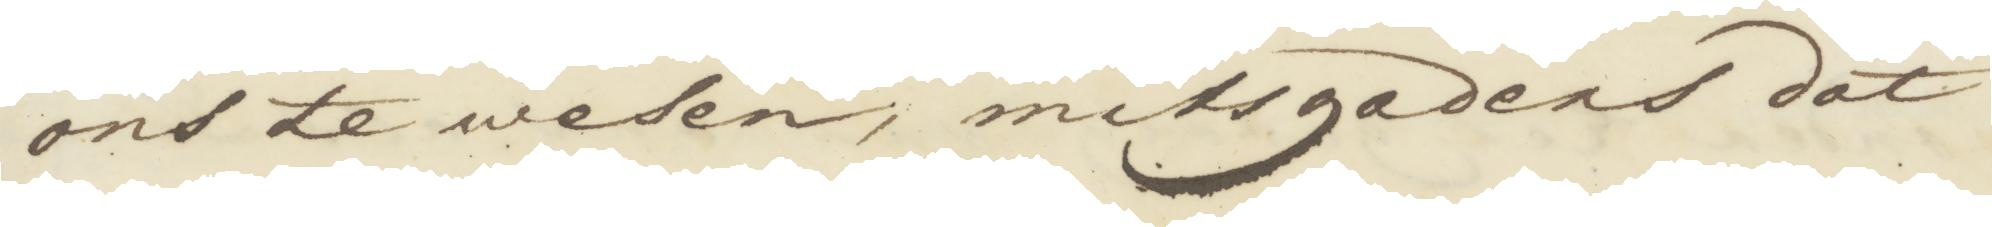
ons te wesen, mitsgaders dat
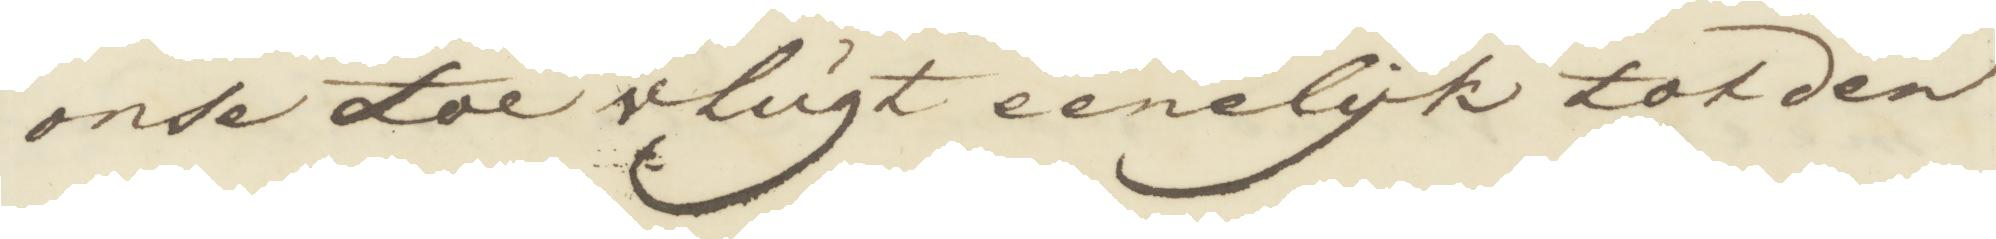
onse toe vlugt eenelijk tot den
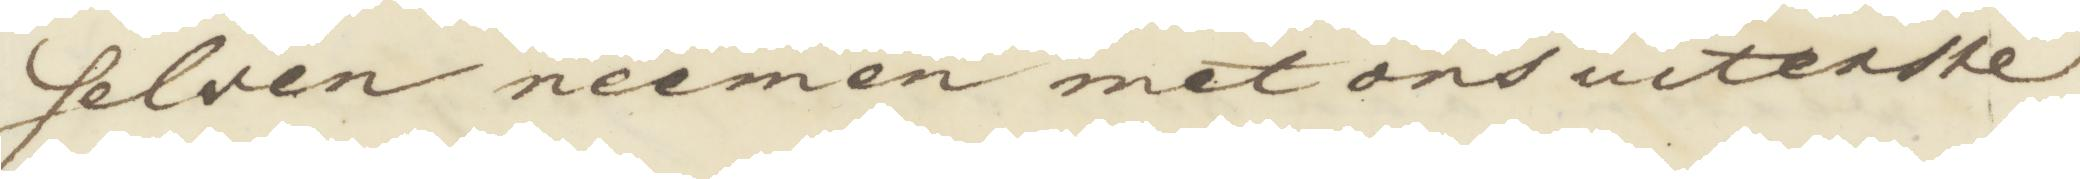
selven neemen met ons uiterste
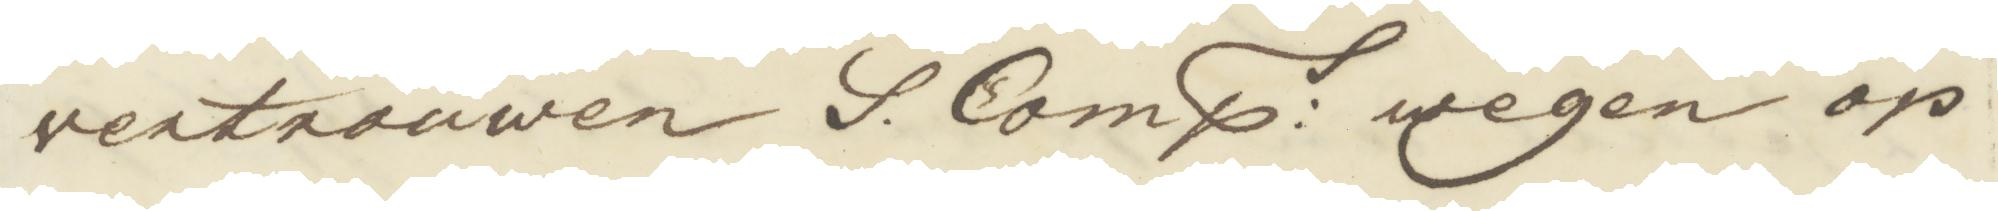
vertrouwen s. Comp:s wegen op
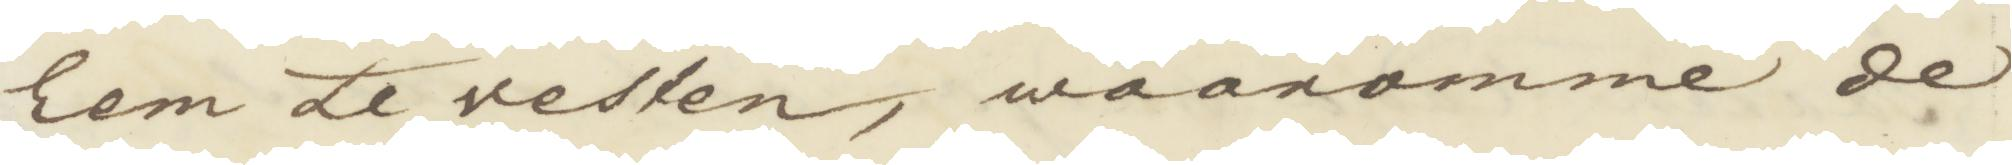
hem te vesten, waaromme de
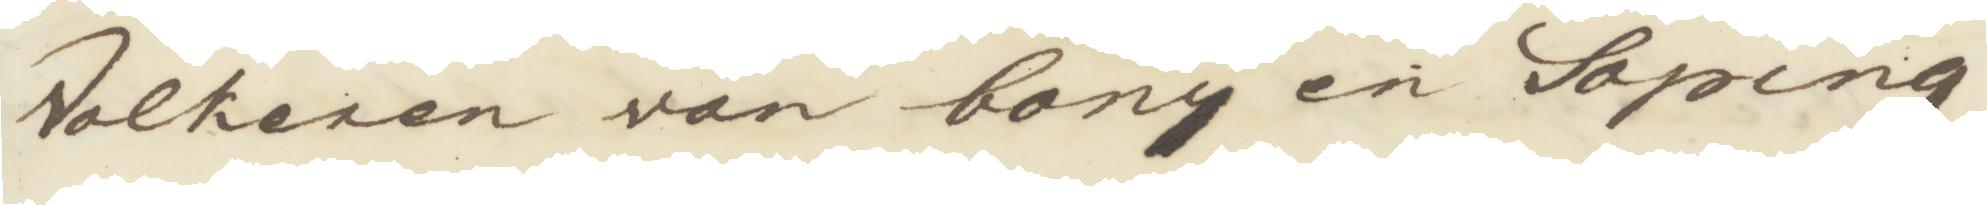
volkeren van bonij en soping
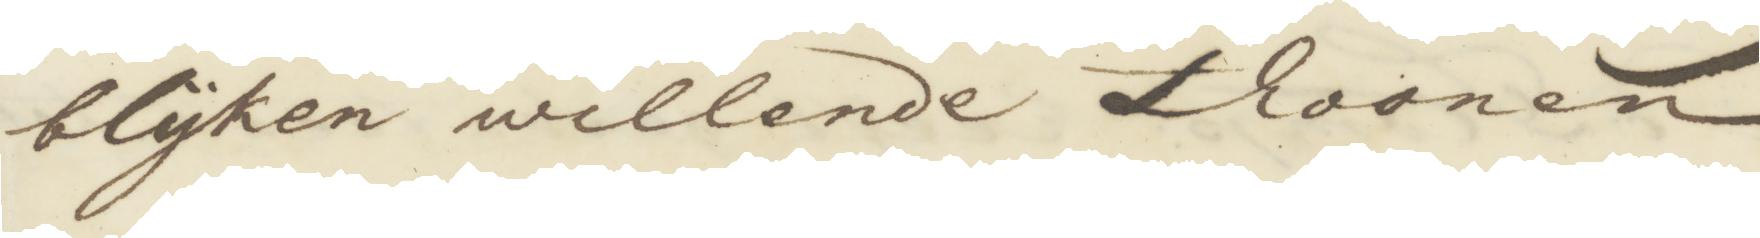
blijken willende thoonen
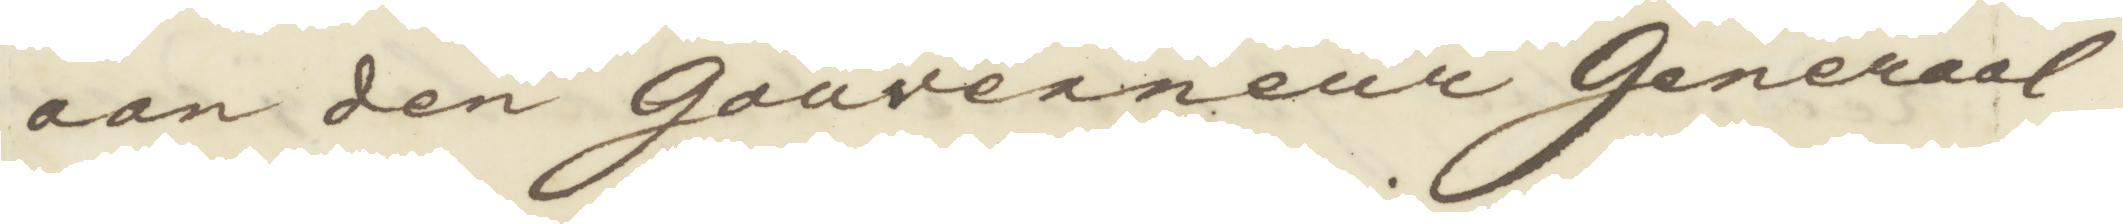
aan den gouverneur generaal
